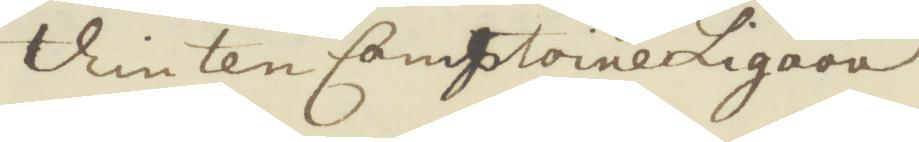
thin ten Comptoire Ligoor
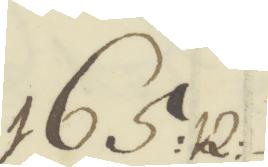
165:12:–:
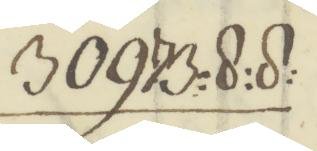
30973:8:8:
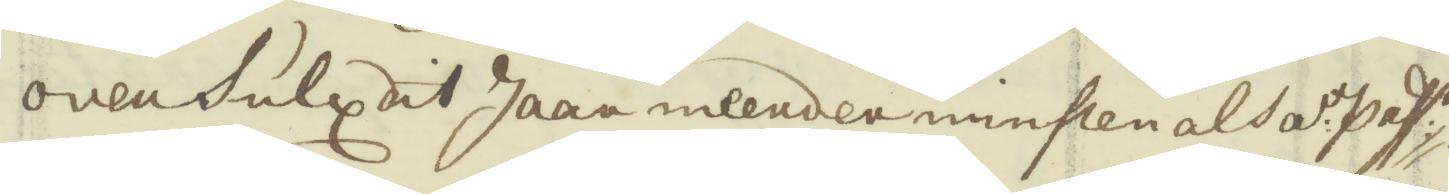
over sulx dit Jaar meerder winsten als a:o pas:o„
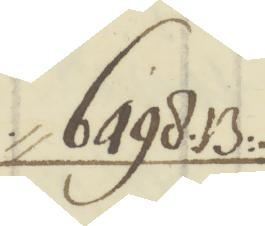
„6498:13:–:
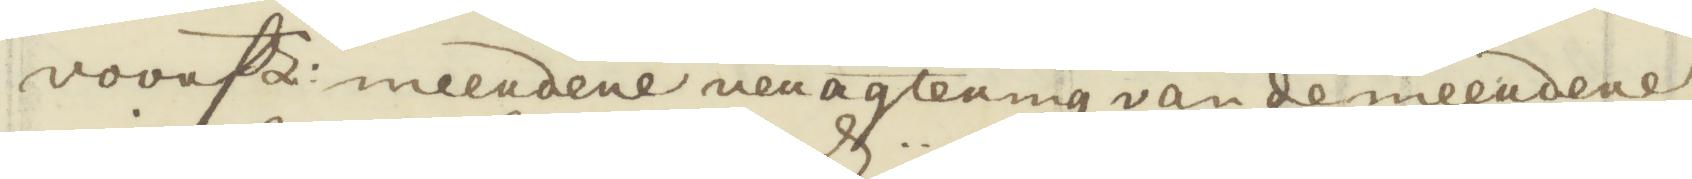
voorsz: meerdere veragtering van de meerdere
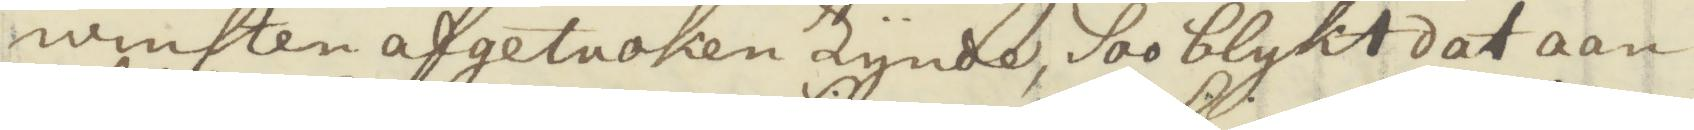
winsten afgetroken zynde, soo blykt dat aan
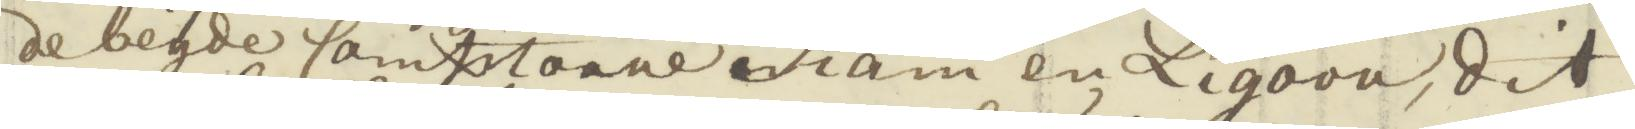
de beijde Comptoire Siam en Ligoor, dit
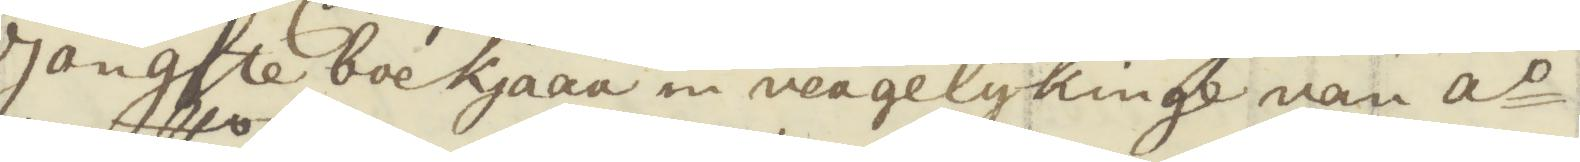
Jongste boekjaar in vergelijkinge van a=o
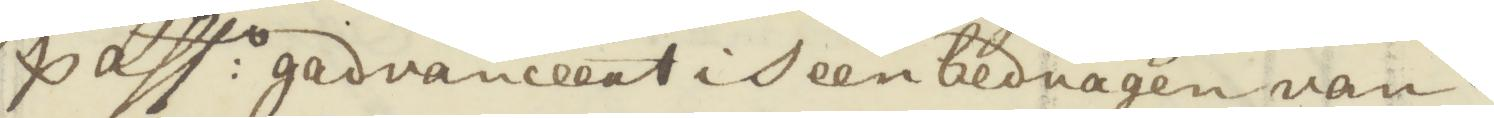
pass:o gadvanceert is een bedragen van .
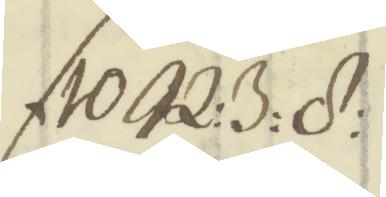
ƒ10423:8:
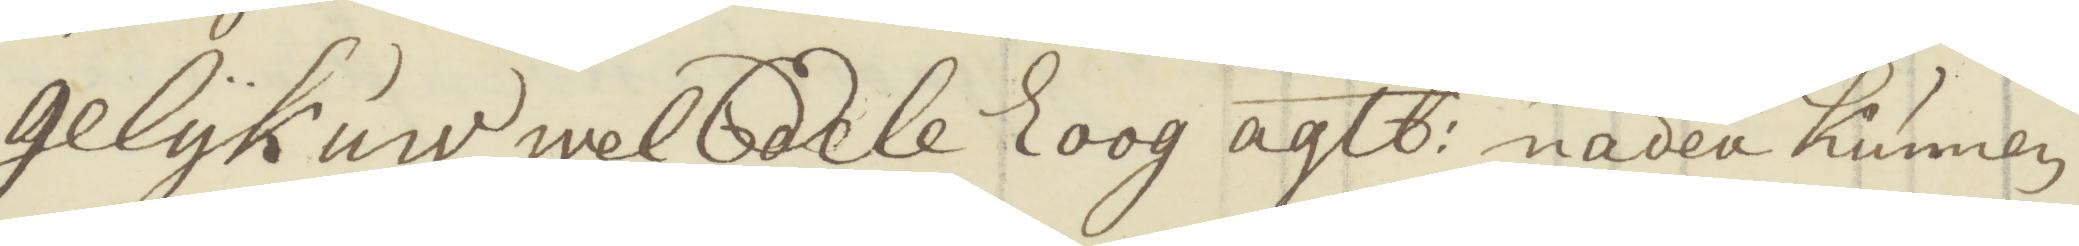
gelijk uw wel Edele hoog agtb: nader kunnen
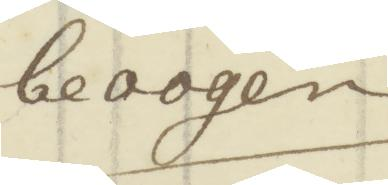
beoogen
